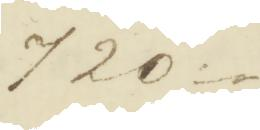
720:—
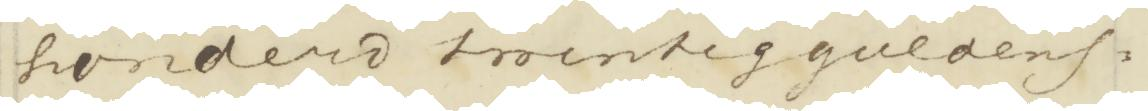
honderd twintig guldens:
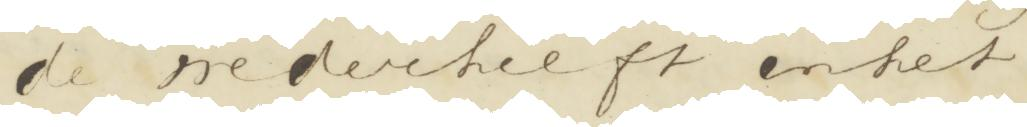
de wederhelft in het
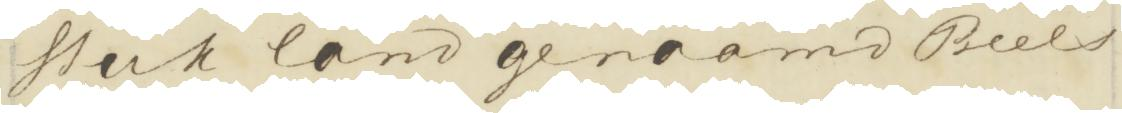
stuk land genaamd Beels
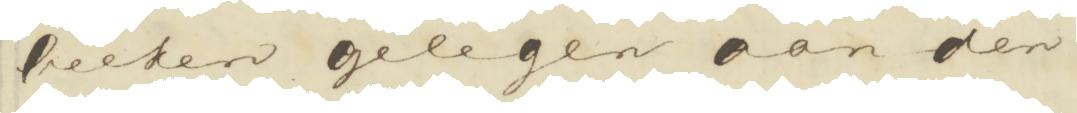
beeken gelegen aan den
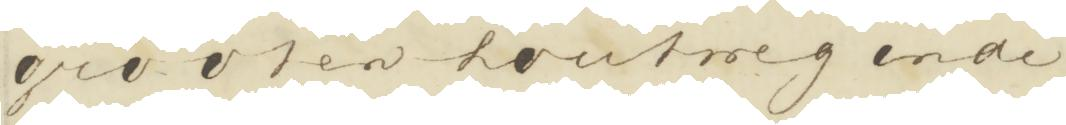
grooten houtweg in de
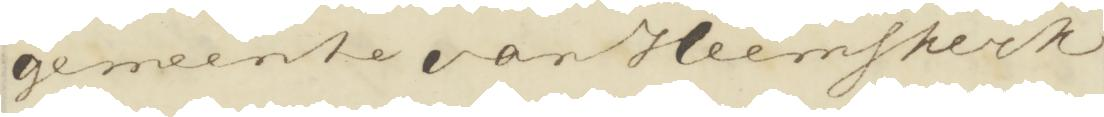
gemeente van Heemskerk
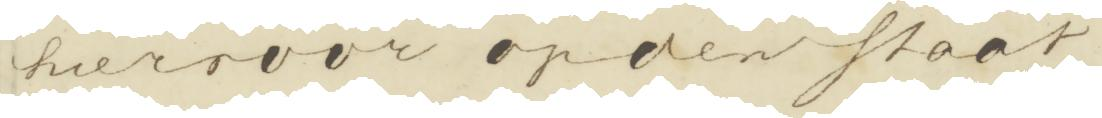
hiervoor op den staat
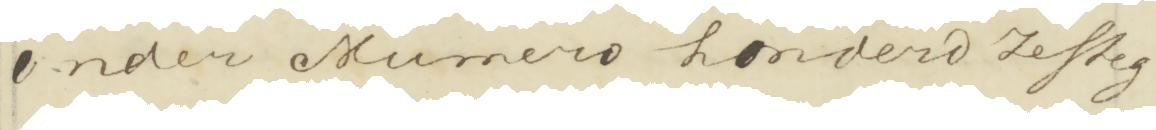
onder Numero honderd Zestig
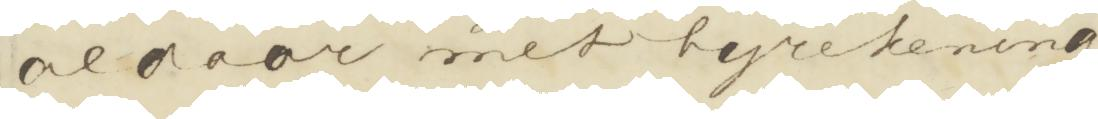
aldaar met byrekening
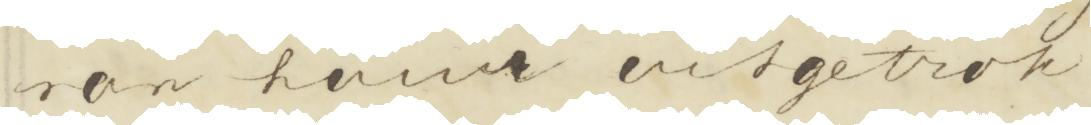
van hunne uitgetrok
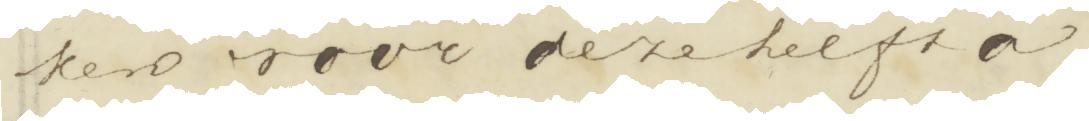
ken voor deze helft a
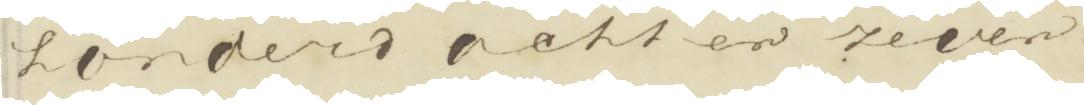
honderd acht en zeven
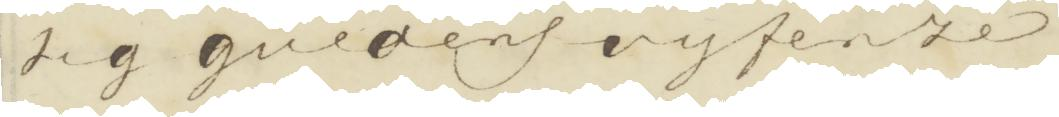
tig guldens vyfenze
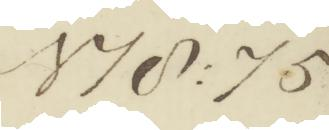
178:75
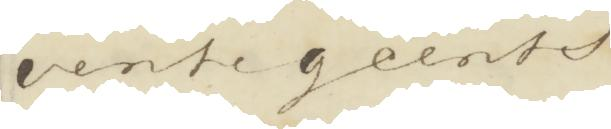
ventig cents
